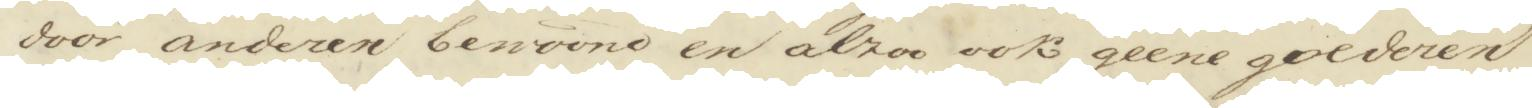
door anderen bewoond en alzoo ook geene goederen
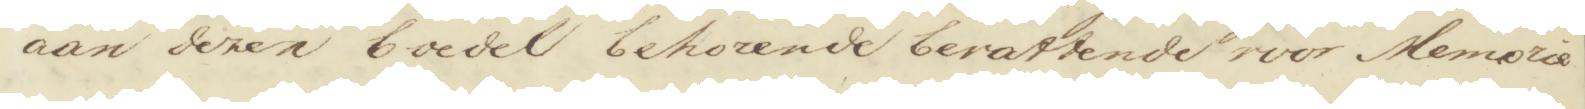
aan dezen boedel behorende bevattende voor Memorie
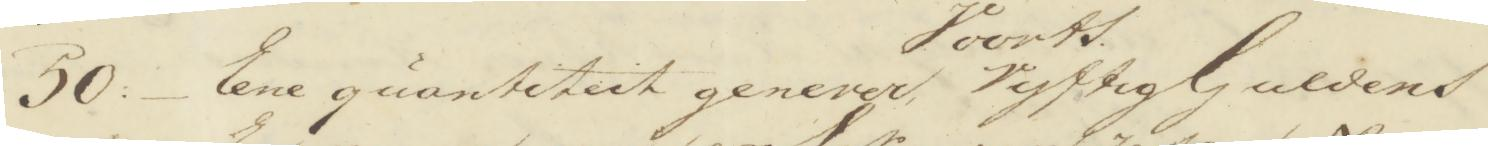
50: — Eene quantiteit genever, Vyftig Guldens
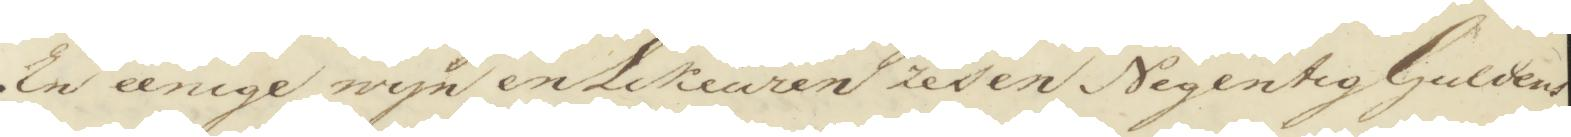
En eenige wyn en Likeuren zesen Negentig Guldens
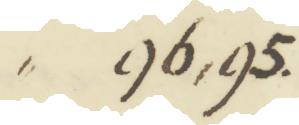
„ 96,95.
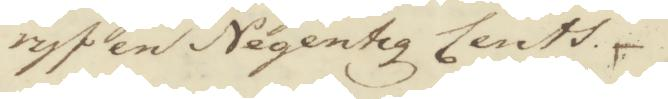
vyf en Negentig Cents. -
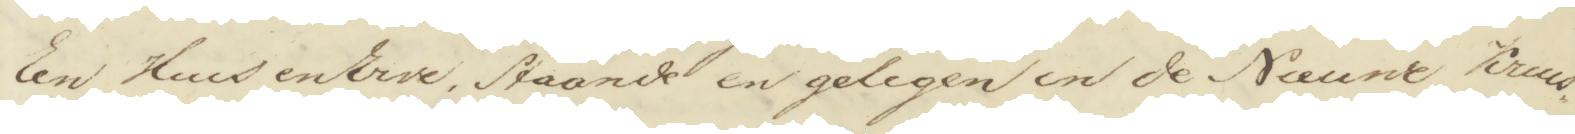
Een Huis en Erve, staande en gelegen in de Nieuwe Kruis„
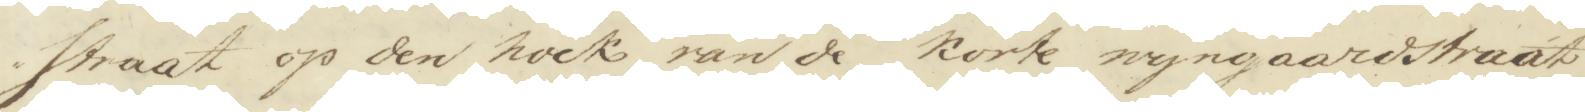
„straat op den hoek van de korte wyngaardstraat
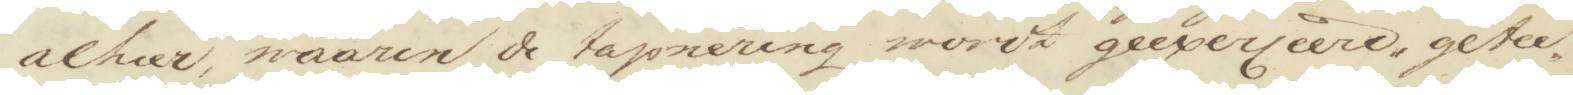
alhier, waarin de tapnering wordt geexerceerd„ getee„
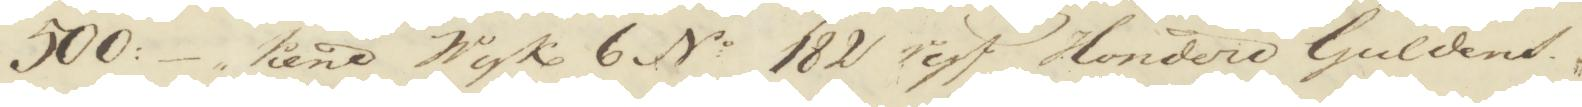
500: —„kend Wyk 6 N:o 182 vijf Honderd Guldens.
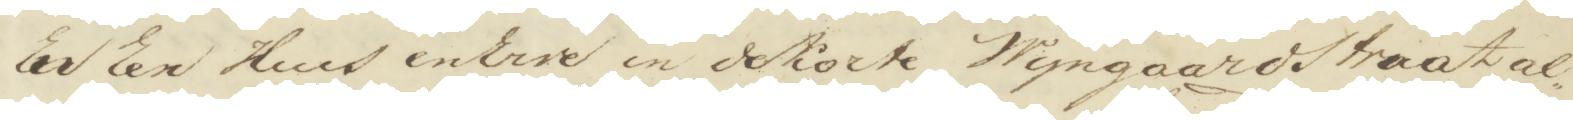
En Een Huis en Erve in dekorte Wyngaardstraat al„
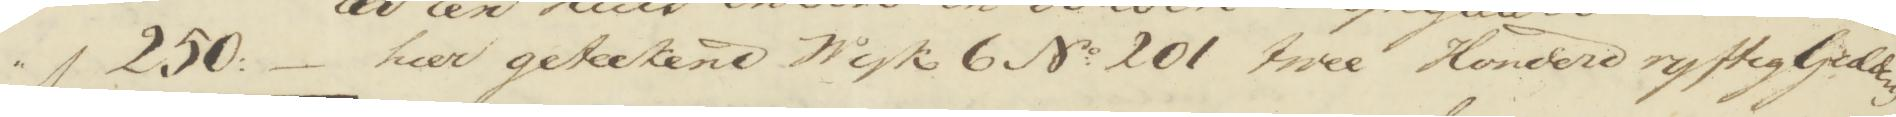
„ 250: — hier geteekend Wyk 6 N:o 201 twee Honderd vyftig Guldens
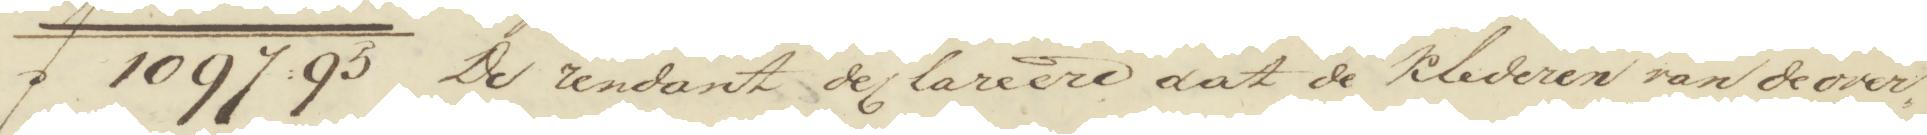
ƒ 1097: 95 De rendant declareerd dat de klederen van de over„
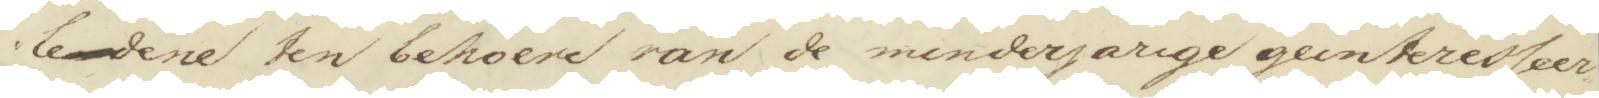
„ledene ten behoeve van de minderjarige geinteresseer
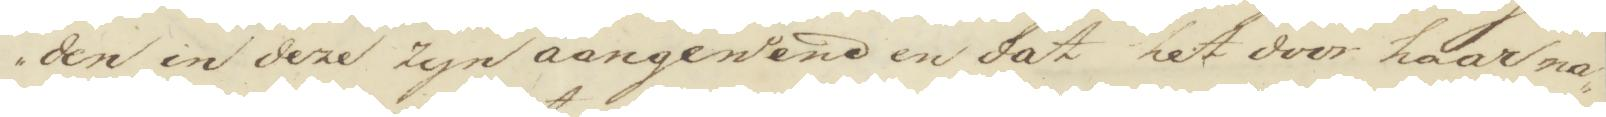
„den in deze zijn aangewend en dat het door haar na„
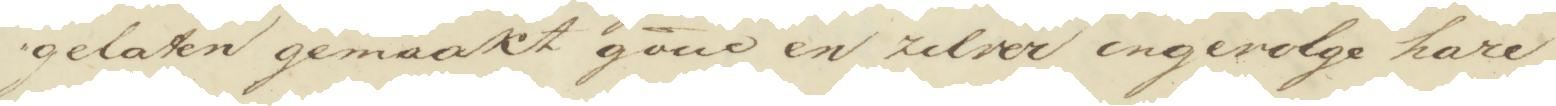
„gelaten gemaakt goud en zilver ingevolge hare
